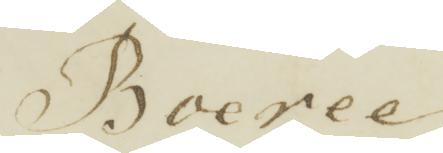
Boeree
